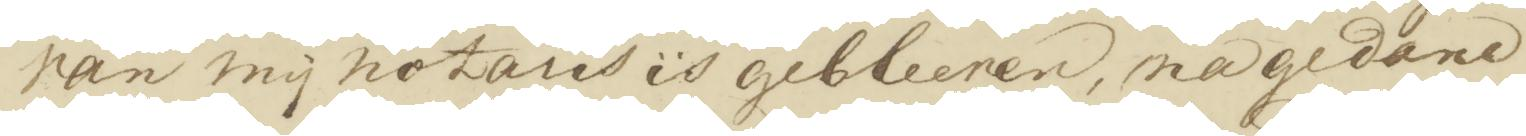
van mij notaris is gebleeren, na gedane
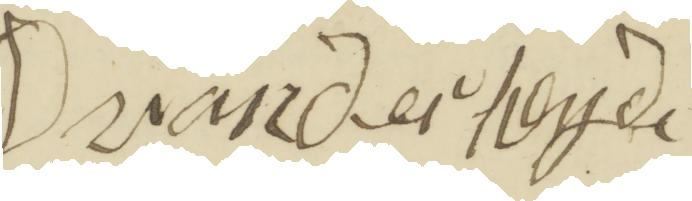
D van der heyde
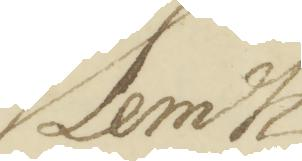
J Lem
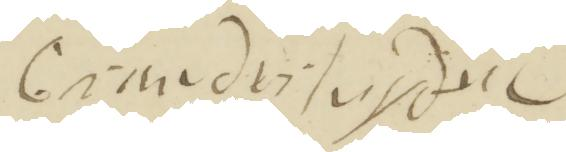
C: van der heyden
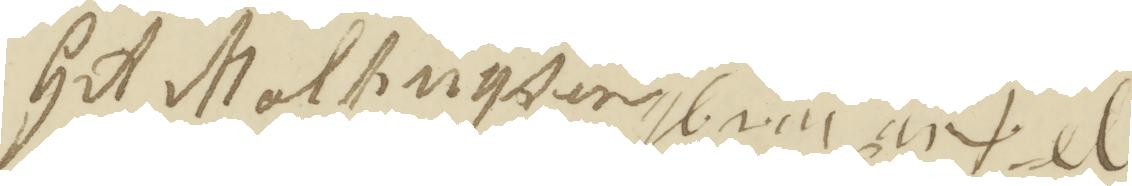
G A Molhuysen G. van arkel
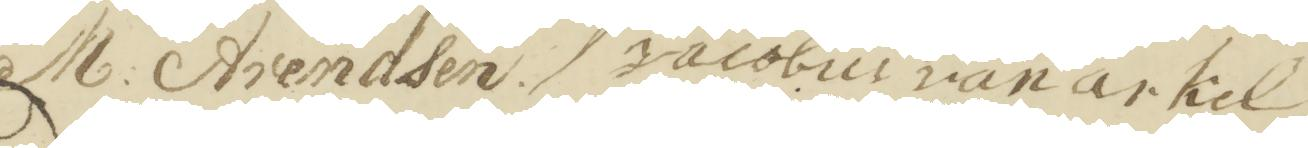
M: Arendsen, Jacobus van arkel
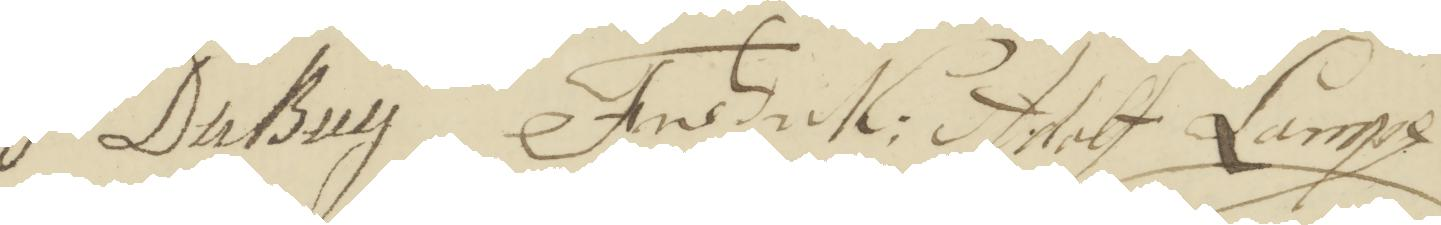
J: Du Buy Fredrik: Adolf Lampe
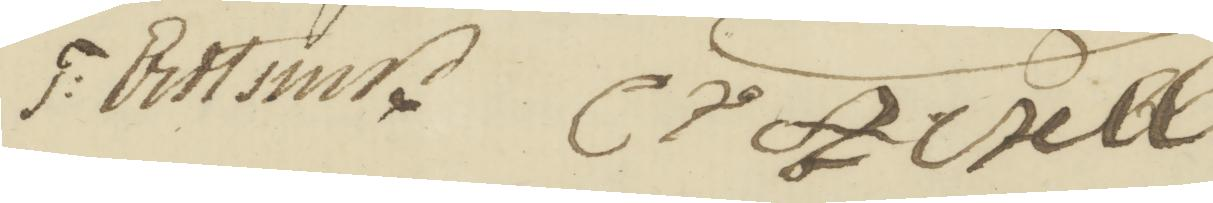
T: Erdtsieck C V Zesell
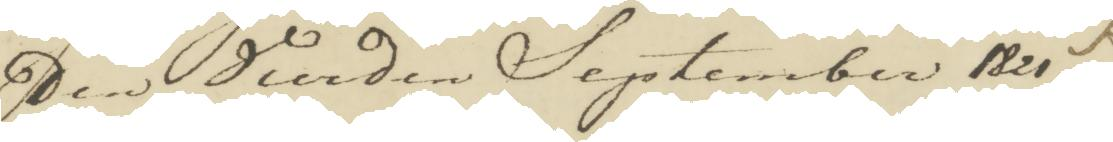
den Vierden September 1821
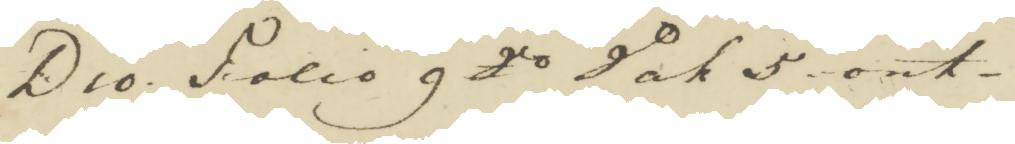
D10. Folio 9 Vo Vak 5 : ont
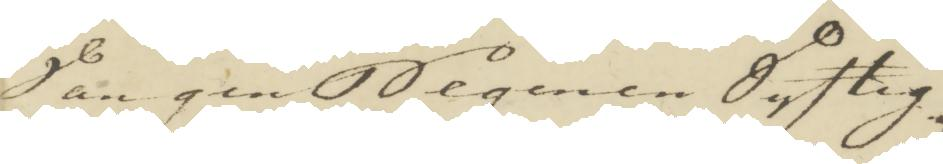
Vangen Negenen Vijftig
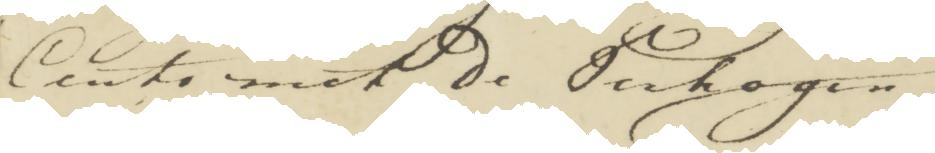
Cents met de Verhogin
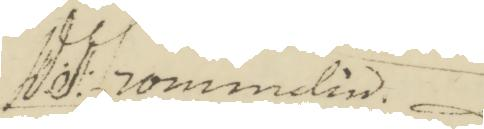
D: J: Crommelin.
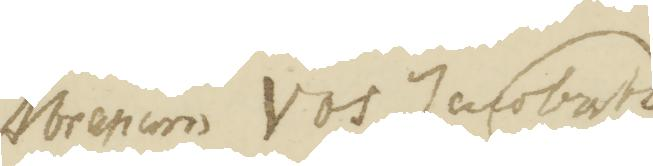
Abraham Vos Jacobart
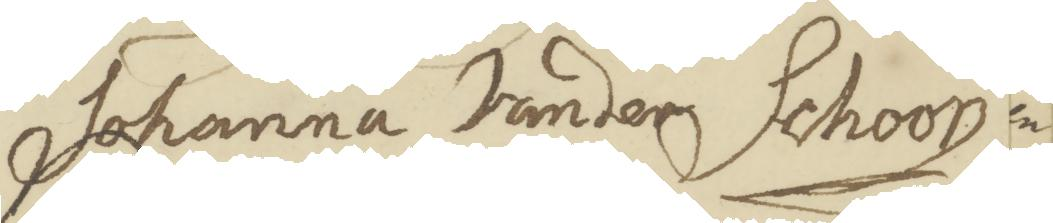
Johanna van der Schoon
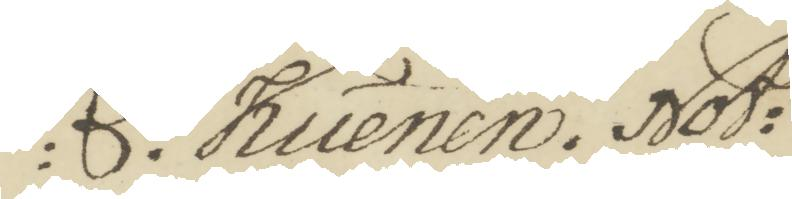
J:P: Kuenen, Not:
